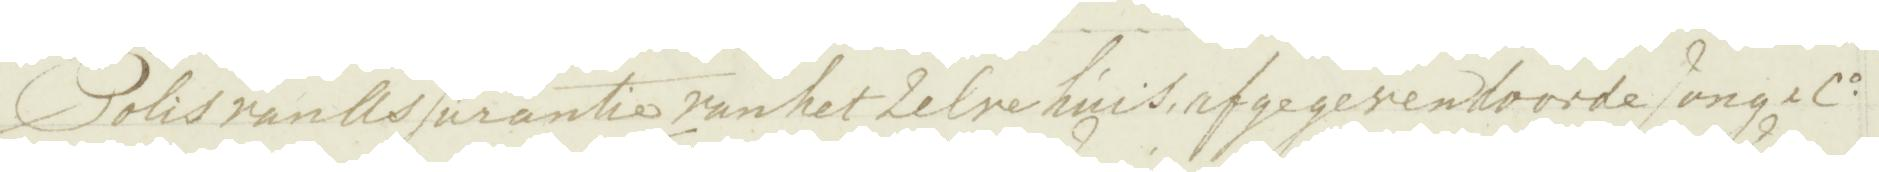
Polis van Assurantie van het zelve huis, afgegeven doorde Jong & C.o
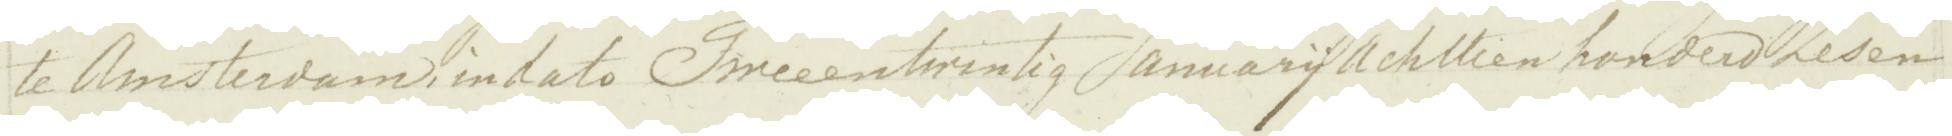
te Amsterdam, in dato Tweeentwintig Januarij Achttien honderd Zes en
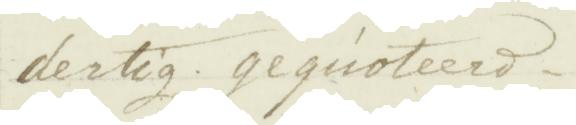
dertig. gequoteerd . . . . . . . . . . . . . . . . . .
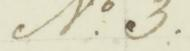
N.o 3.
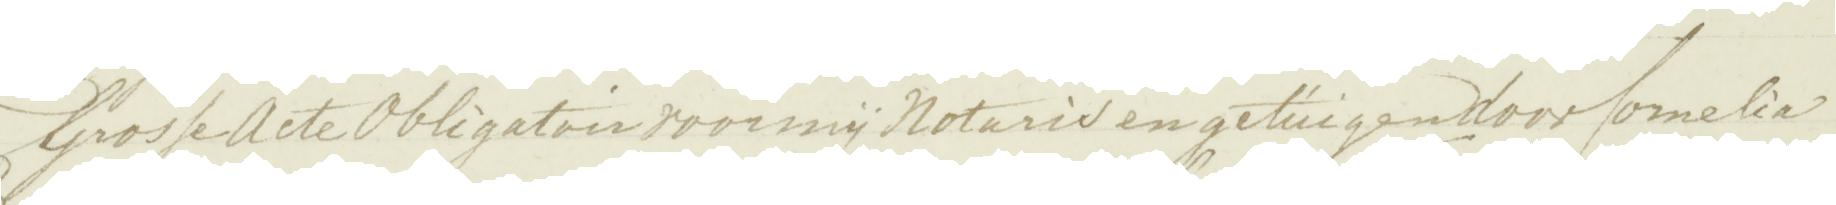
Grosse Acte Obligatoir voor mij Notaris en getuigen door Cornelia
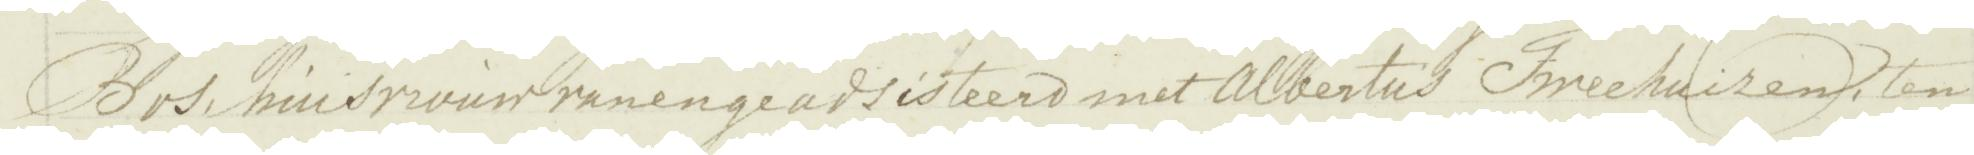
Bos, huisvrouw van en geadsisteerd met Albertus Tweehuizen, ten
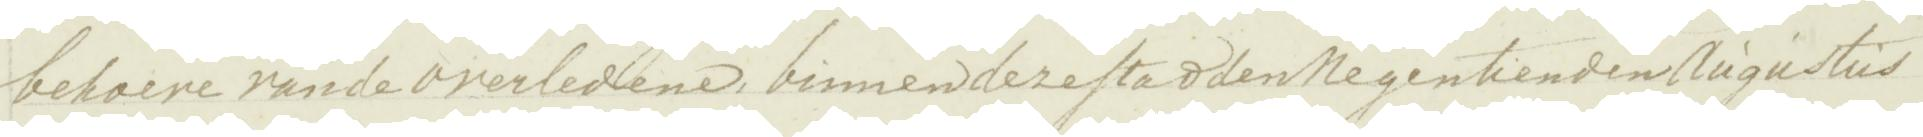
behoeve van de overledene, binnen deze stad den Negentienden Augustus
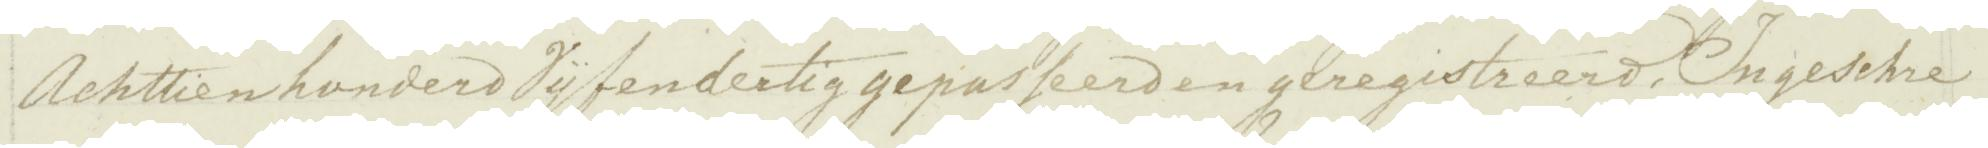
Achttien honderd Vijf endertig gepasseerd en geregistreerd, Jngeschre
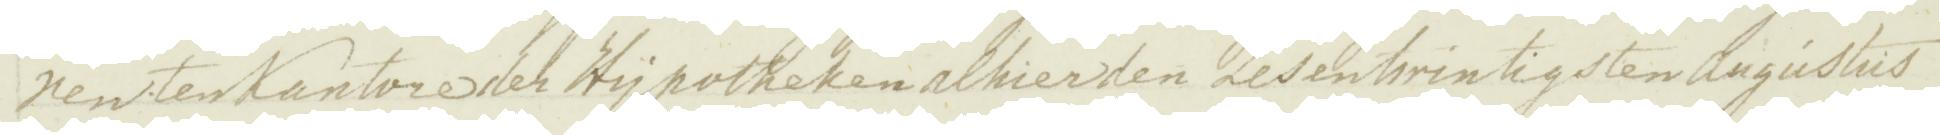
ven ten kantore der Hijpotheken alhier den Zes entwintigsten Augustus
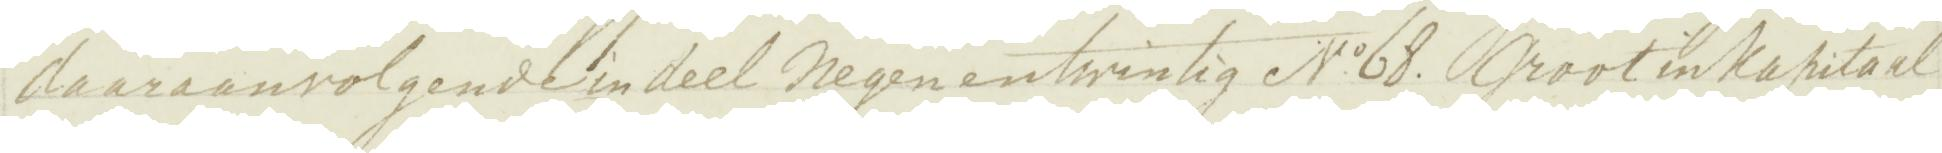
daaraanvolgende in deel negen entwintig N.o 68. Groot in Kapitaal
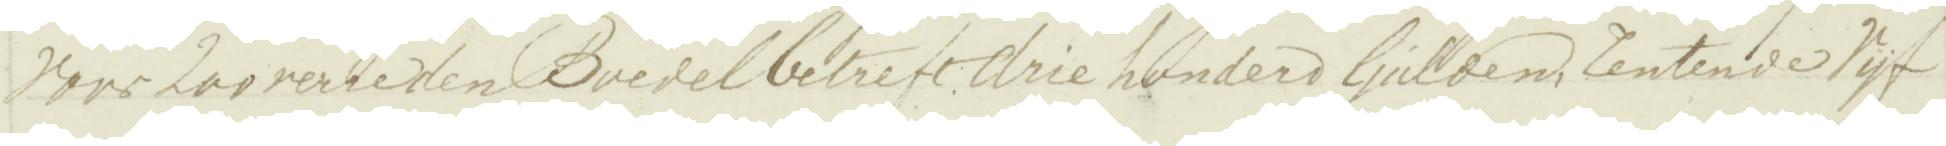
Voor Zoo verre den Boedel betreft, drie honderd Gulden, rentende Vijf
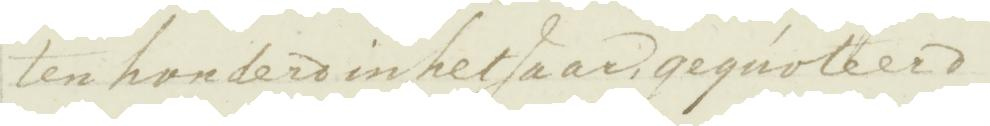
ten honderd in het Jaar, geguoteerd . . . . . . . . . . . . . .
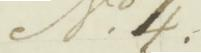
N.o 4.
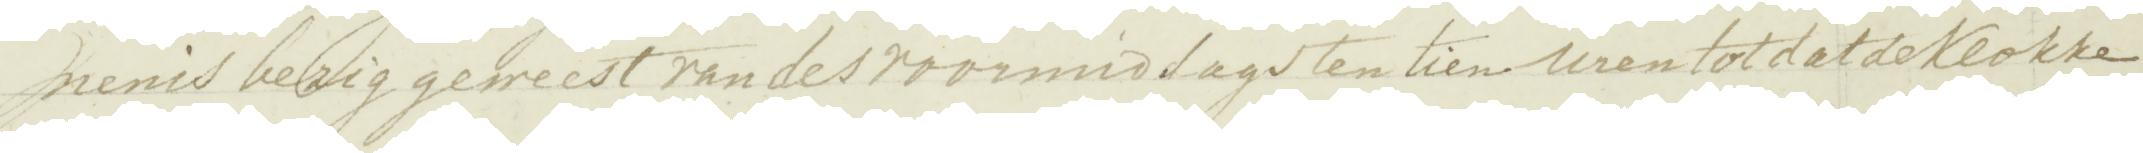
men is bezig geweest van des voormiddags ten tien uren tot dat de klokke
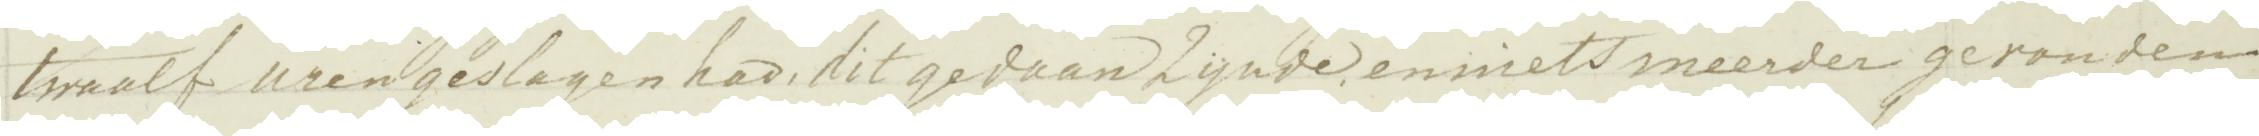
twaalf uren geslagen had, dit gedaan zijnde, en niets meerder gevonden
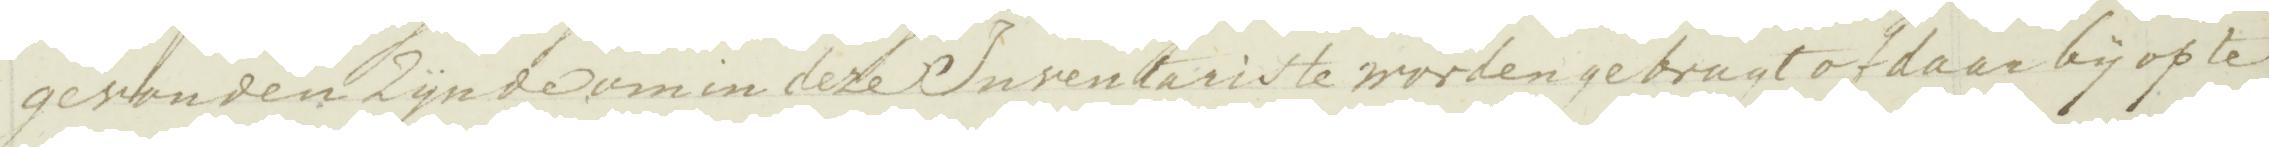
gevonden zijnde om in deze Jnventaris te worden gebragt of daar bij op te
